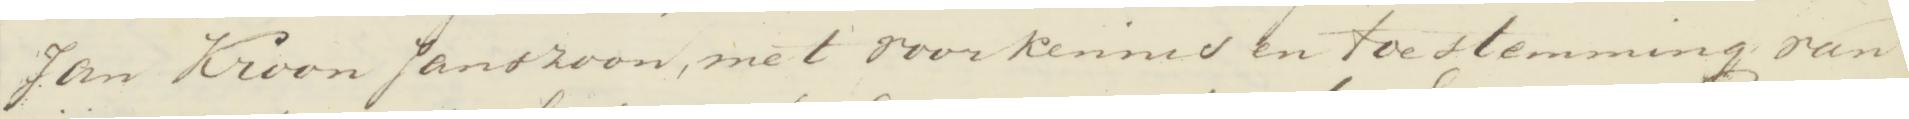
Jan Kroon Janszoon, met voorkennis en toestemming van
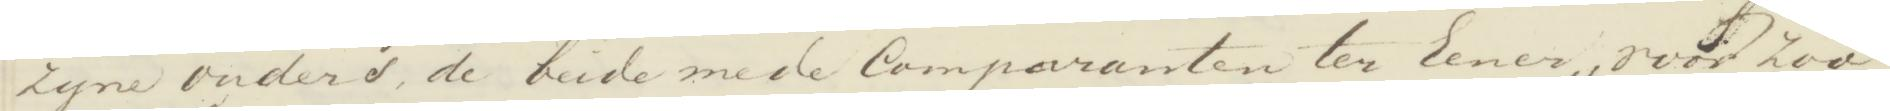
zijne ouders, de beide mede Comparanten ter Eener, voor zoo
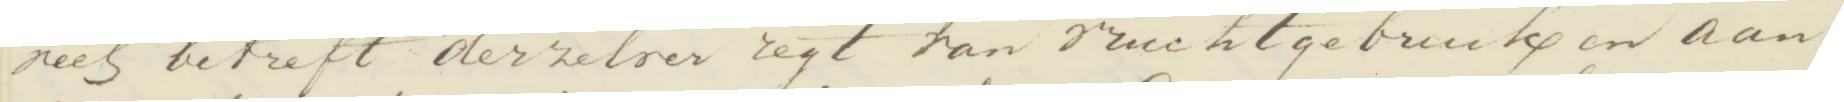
veel betreft derzelver regt van Vruchtgebruik en aan
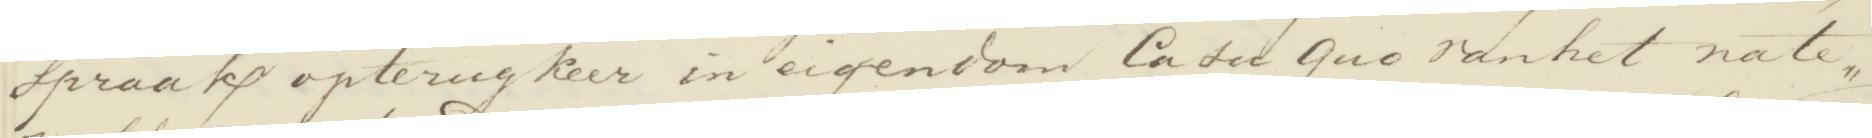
spraak op terugkeer in eigendom Casu quo van het nate„
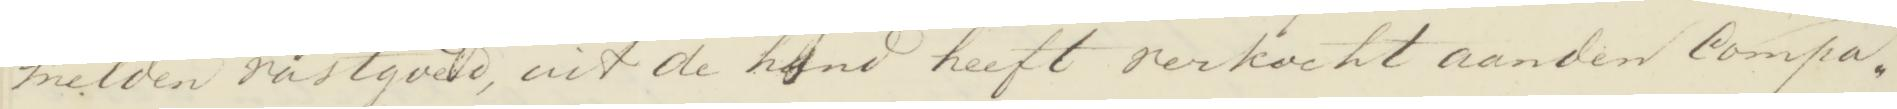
melden vastgoed, uit de hand heeft verkocht aan den Compa„
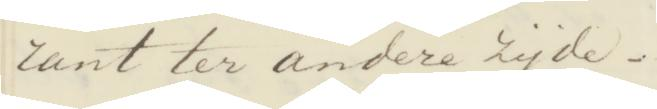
rant ter andere zijde -
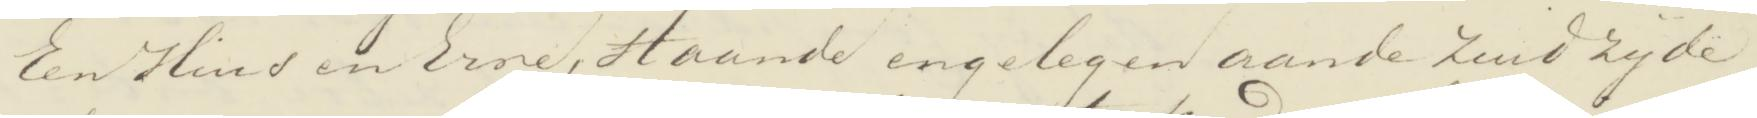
Een Huis en Erve, staande engelegen aande zuid zyde
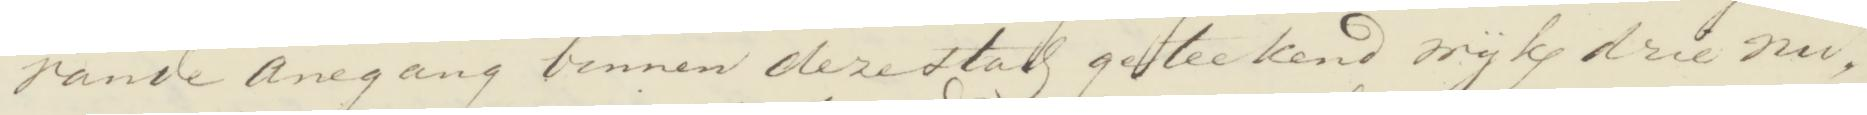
vande Anegang binnen deze stad geteekend wijk drie nu„
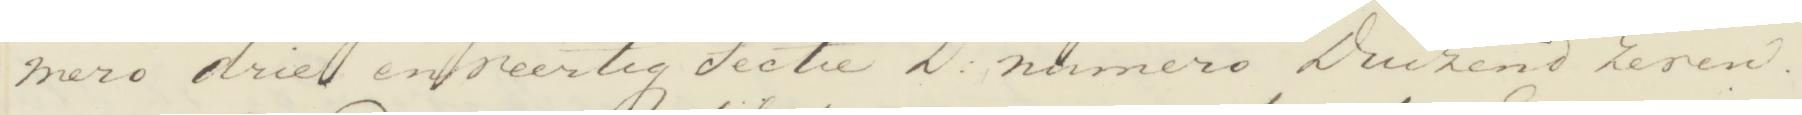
mero drie en veertig sectie D: numero Duizend zeven.
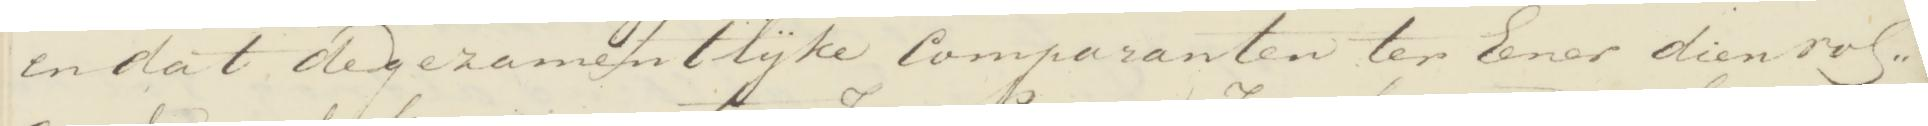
en dat de gezamentlijke comparanten ter Eener dien vol„
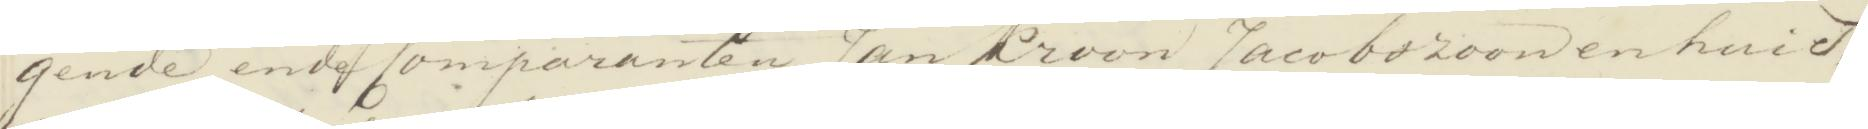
gende ende Comparanten Jan Kroon Jacobszoon en huis
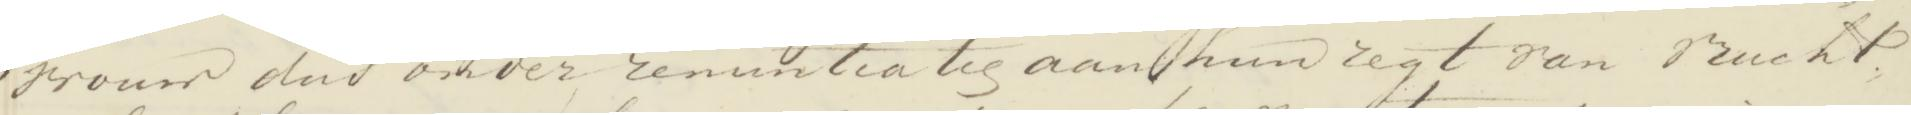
vrouw dus onder renuntiatie aan hun regt van Vrucht„
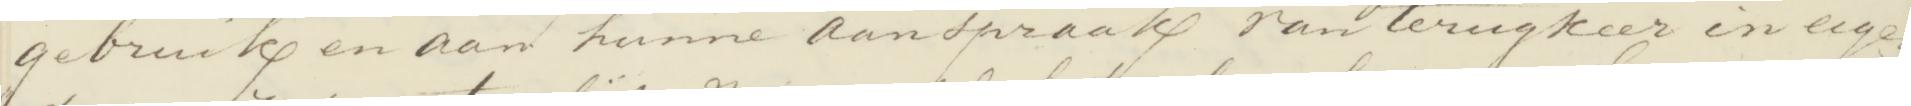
gebruik en aan hunne aanspraak van terugkeer in eigen„
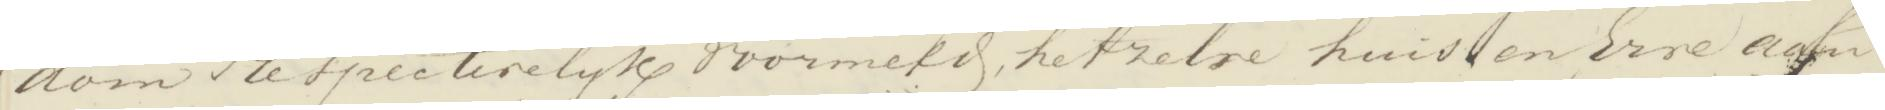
dom respectivelijk voormeld, hetzelve huis en Erve aan
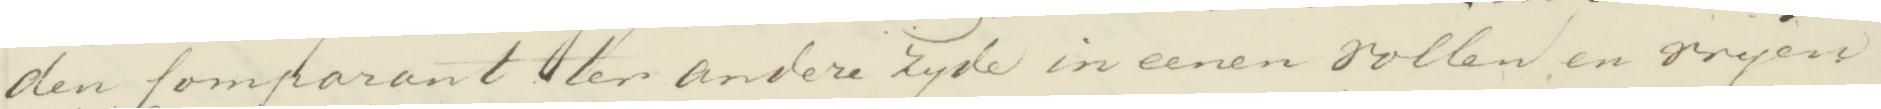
den Comparant ter andere zyde in eenen vollen en vryen
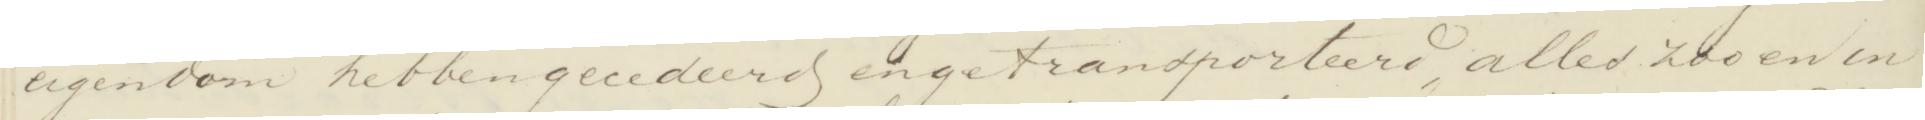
eigendom hebben gecedeerd en getransporteerd, alles zoo en in
